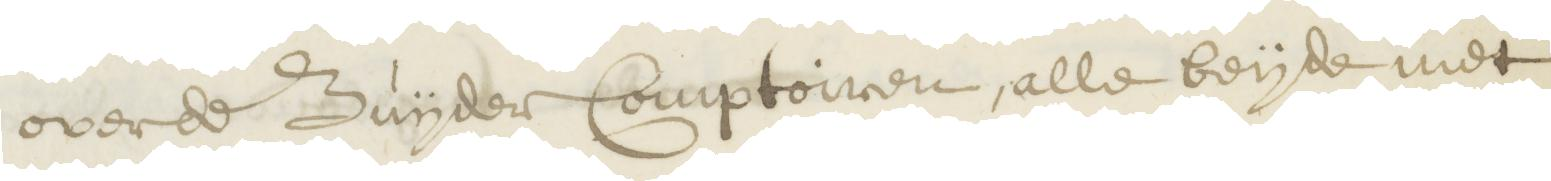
overde Zuijder Comptoiren, alle beijde met
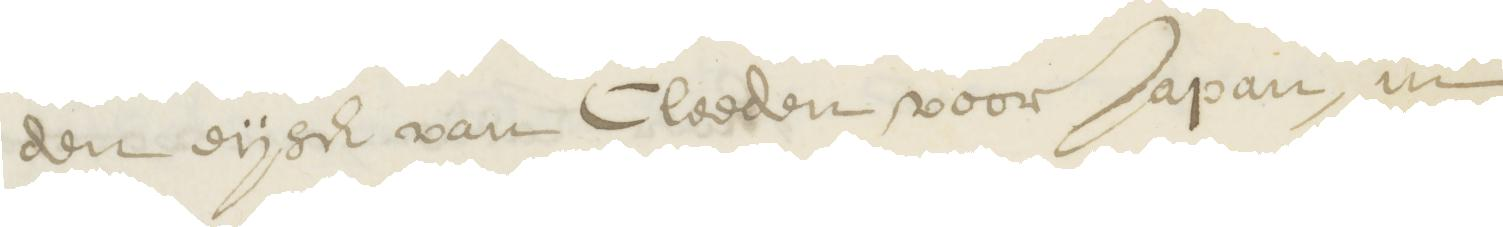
den eijsch aan Cleeden voor Japan, in
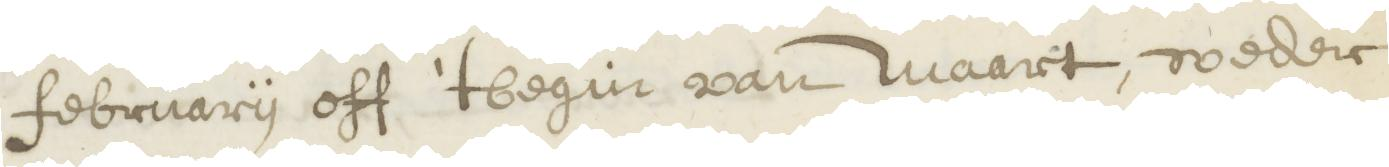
febuarij off ’t begin van maart, weder
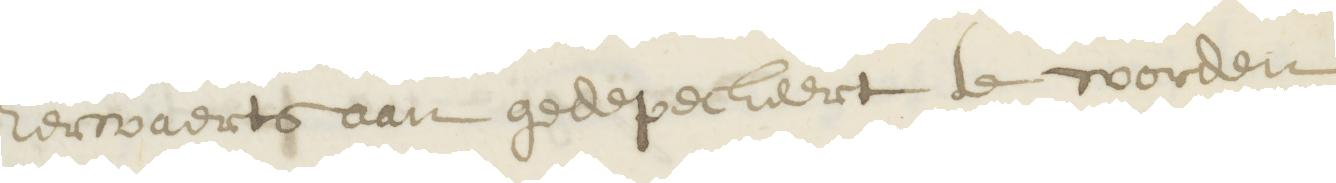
herwerts aan gedepecheert te worden
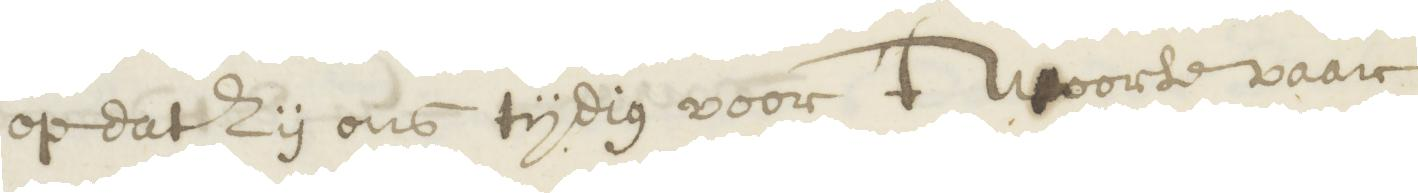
op dat zij ons tijdig voor ’t noorse vaar
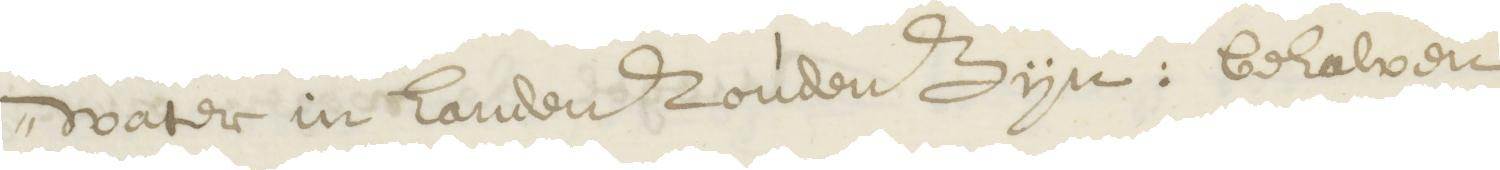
„water in handen zouden zijn: behalven
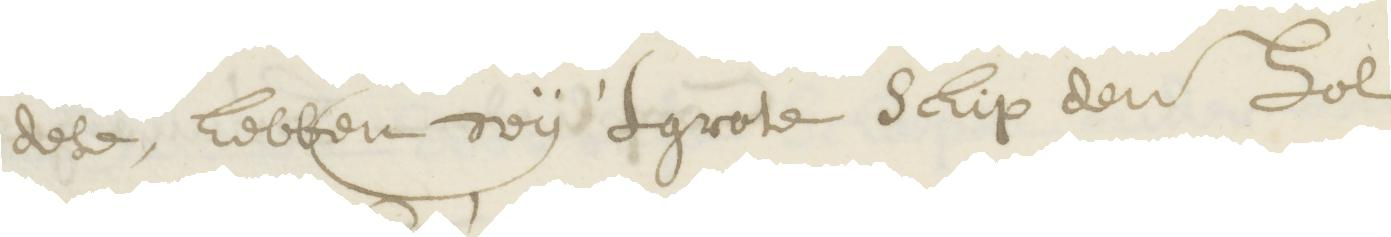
dese, hebben wij ’t grote schip den hol
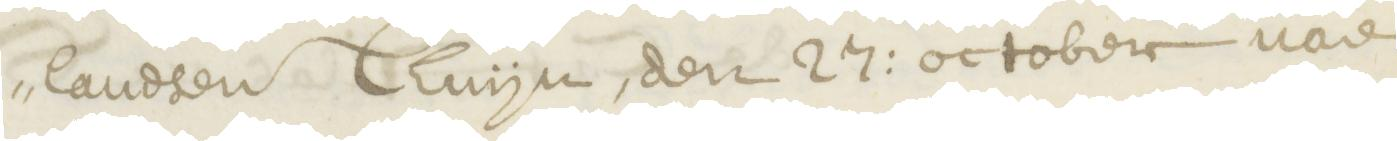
„landsen Thuijn, den 27: october nae
